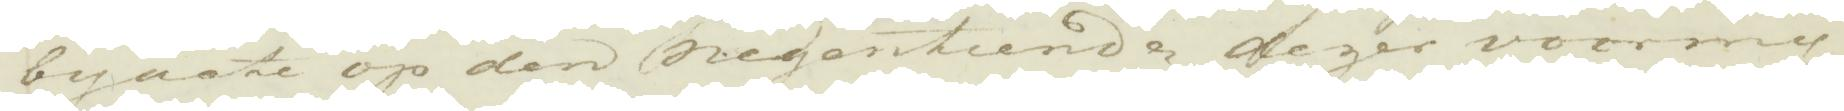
by acte op den negentienden dezer voor my
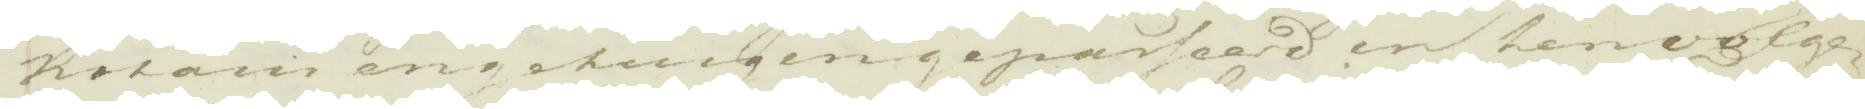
notaris en getuigen gepasseerd en tenvolgen
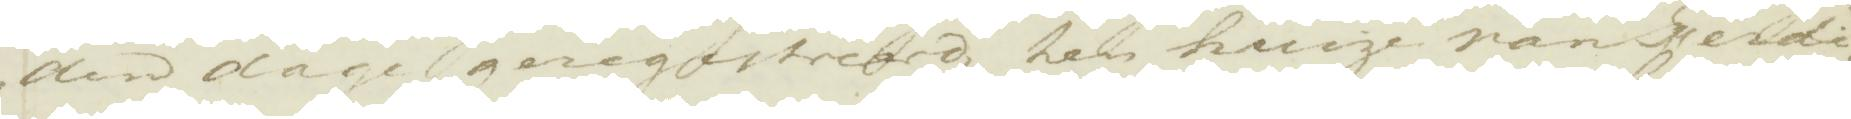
den dage geregistreerd, ten huize van Ferdi
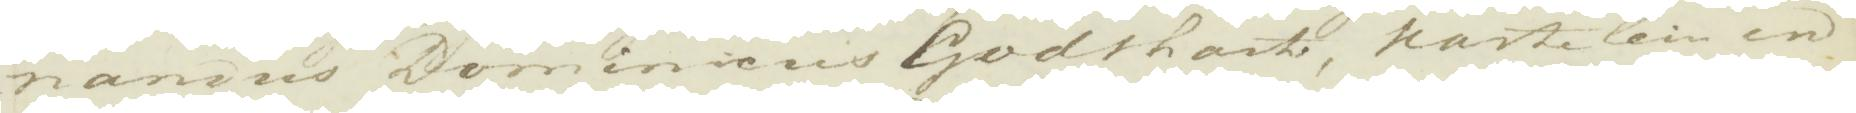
nandus Dominicus Godthart, kastelein in
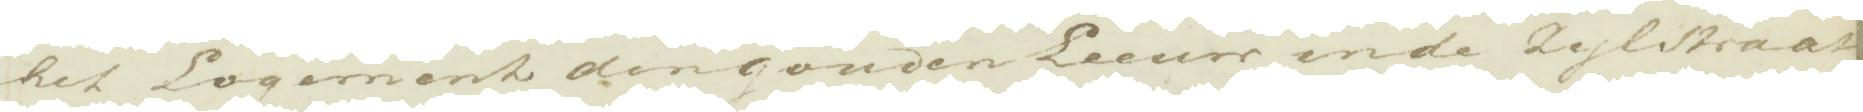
het Logement den gouden Leeuw in de Zylstraat
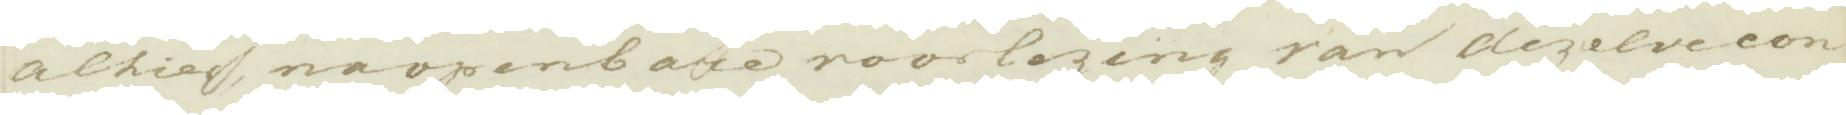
alhier, na openbare voorlezing van dezelve con
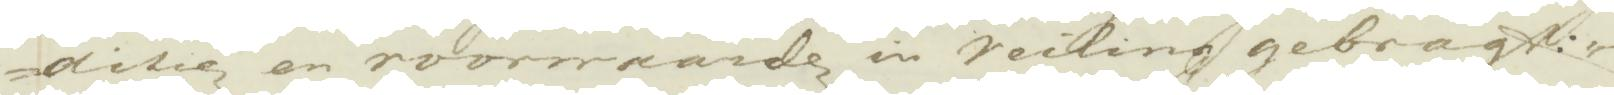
„ditien en voorwaarden in veiling gebragt: „
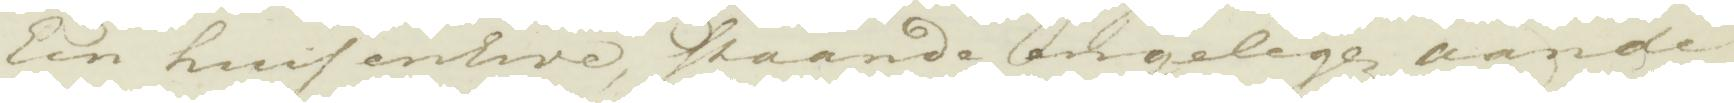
Een huis en Erve, staande en gelegen aan de
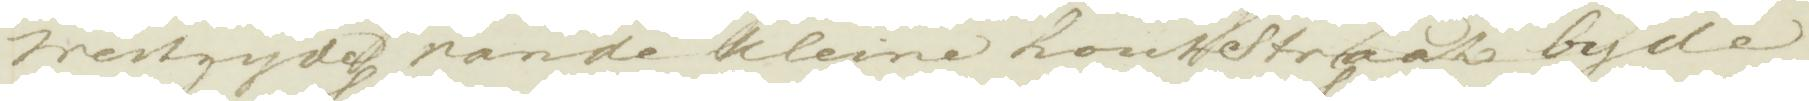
westzyde vande kleine houtstraat by de
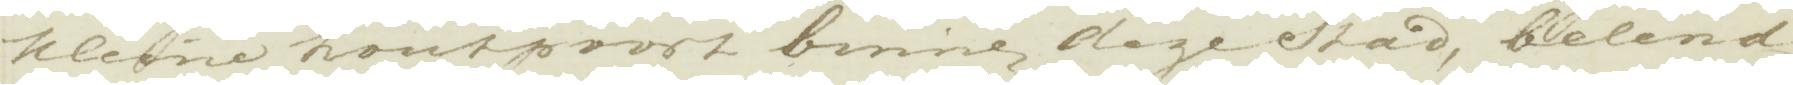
kleine houtpoort binnen deze Stad, belend
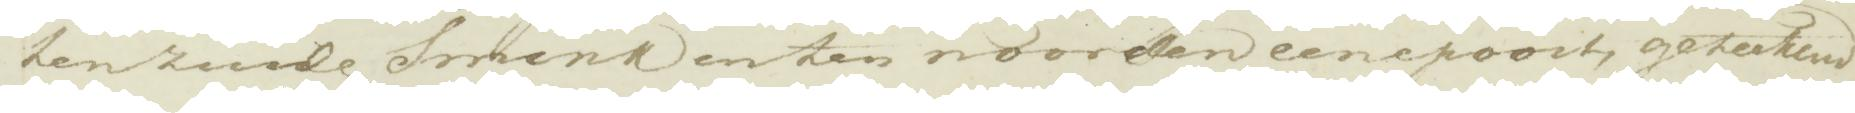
ten zuiden Smink en ten noorden eene poort geteekend
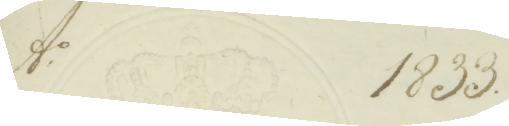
A.o 1833.
